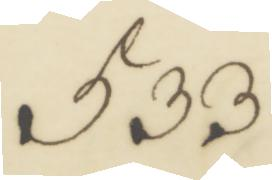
533
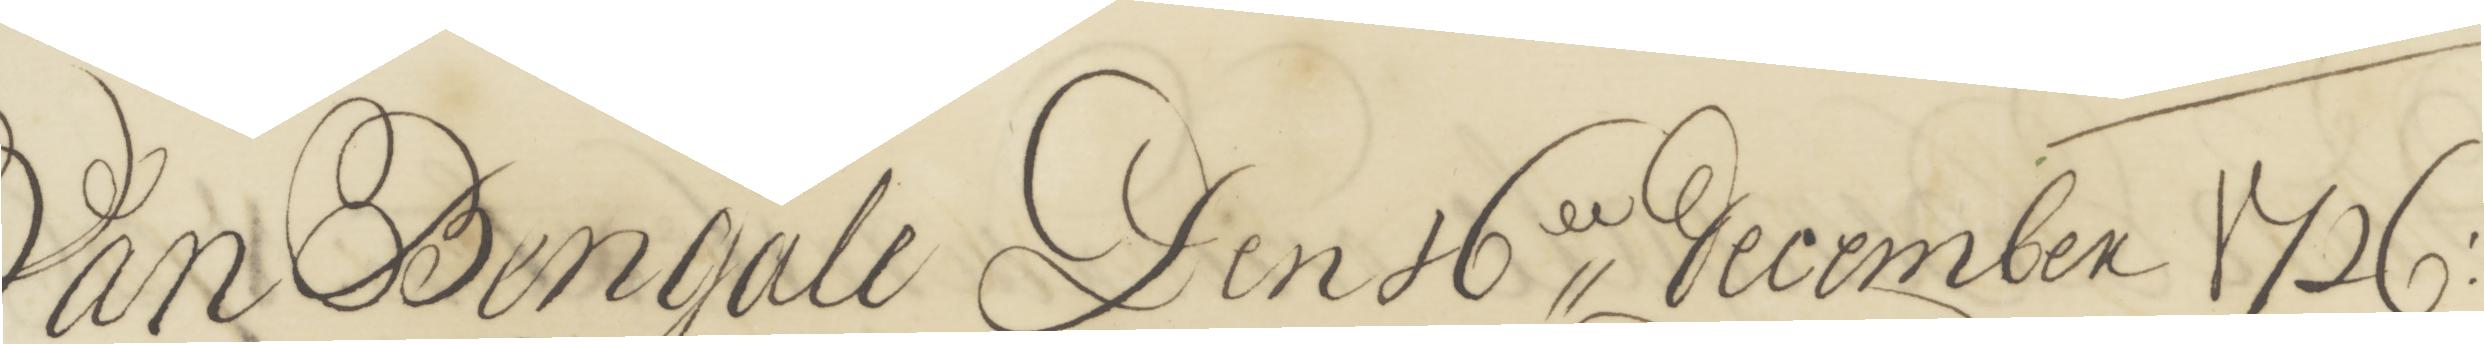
Van Bengale Den 16„e December 1726:
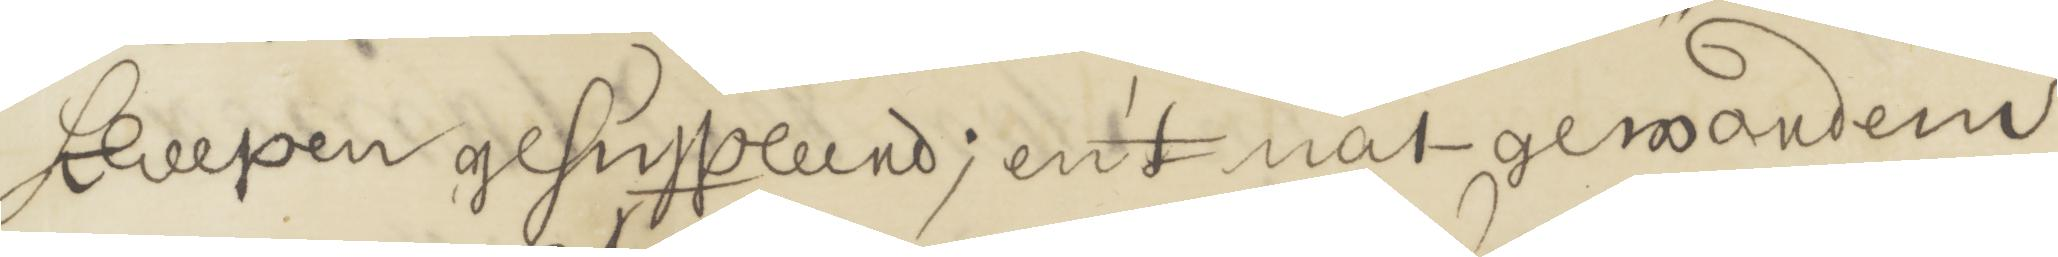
scheepen gesuppleerd; en’t nat gewordene
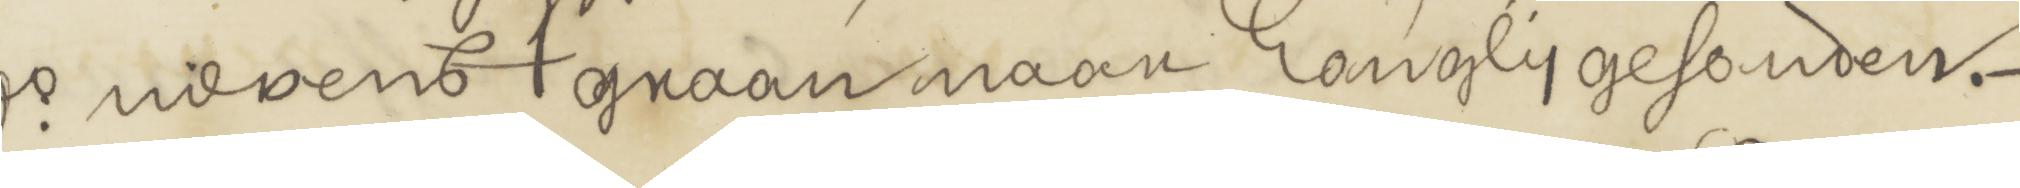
d:o nevens 't graan naar houglij gesonden.
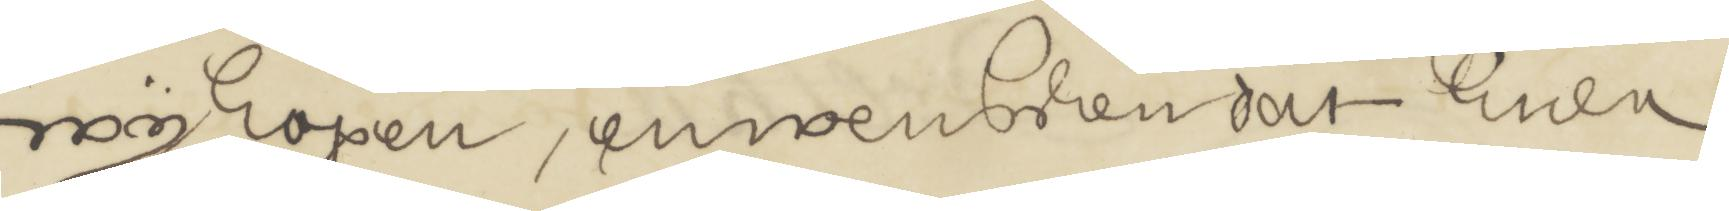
wij hopen, en wenschen dat hier
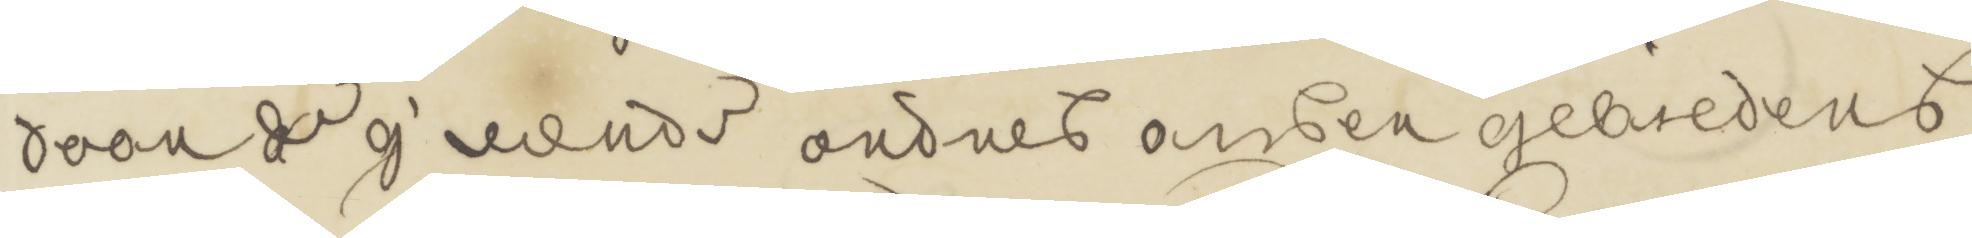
door de g’eerde ordres onser gebieders
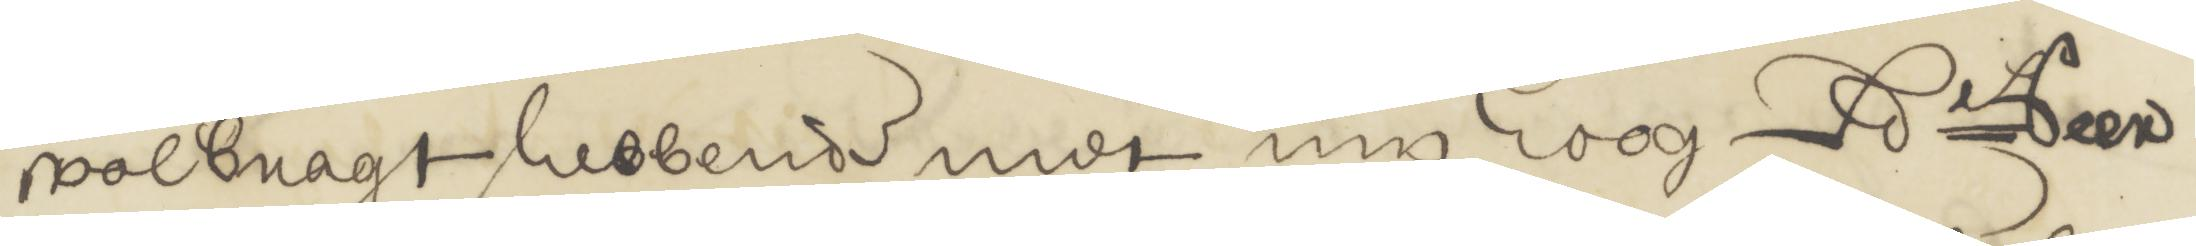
volbragt hebbende met uw hoog Ed=s seer
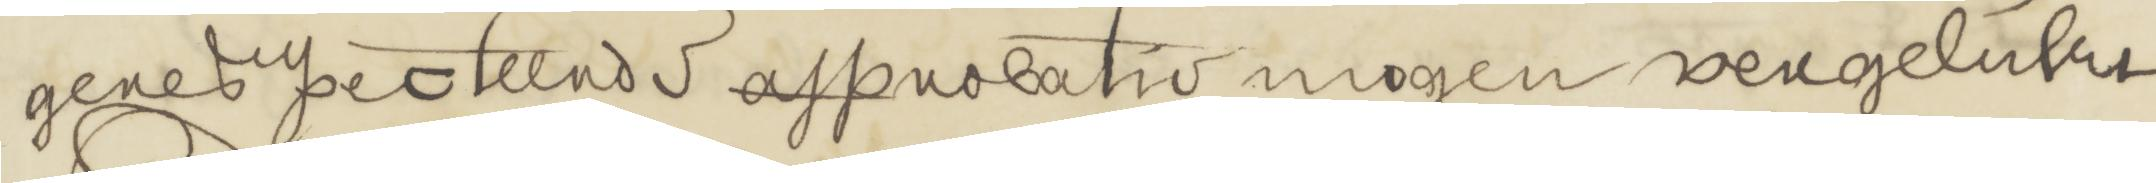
gerespecteerde approbatie mogen vergelukt
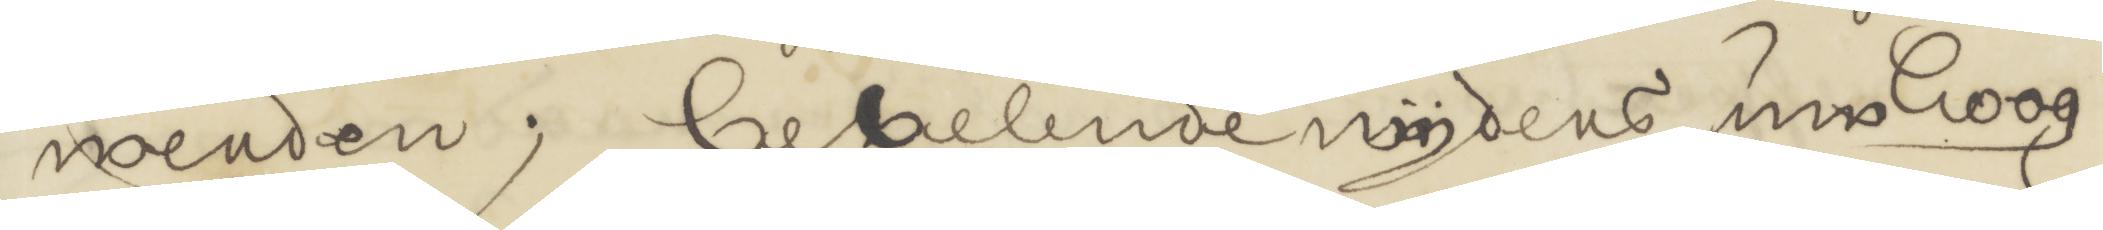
werden; bevelende wijders, uw hoog
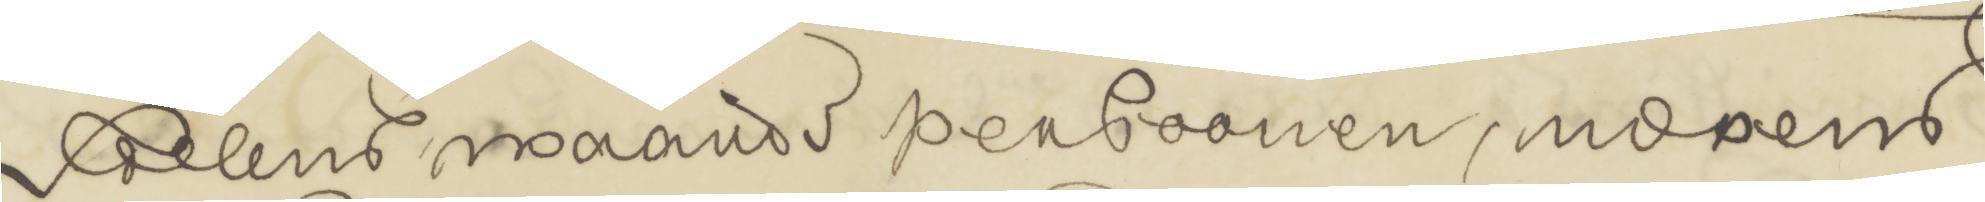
Edelens waarde persoonen, nevens
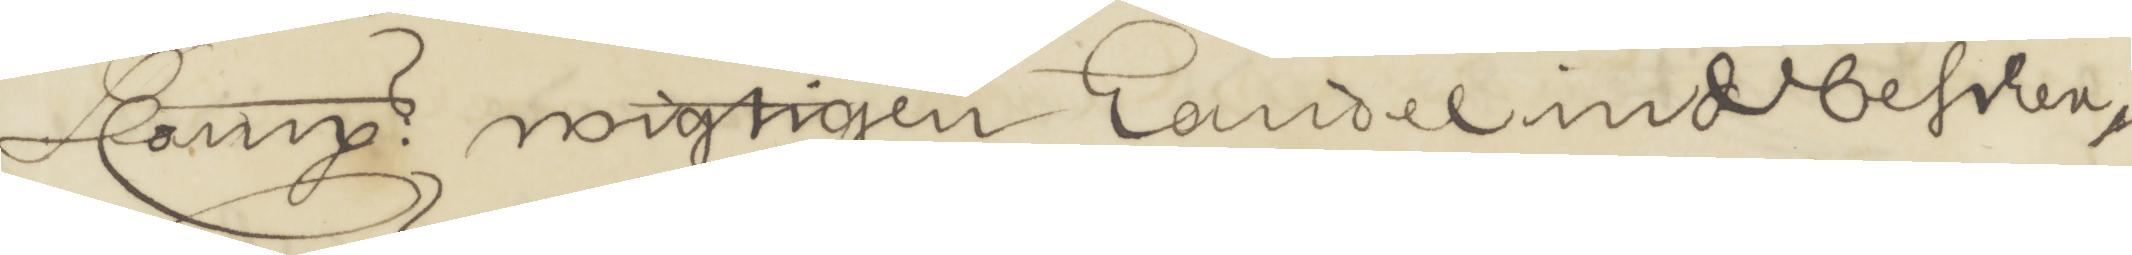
SComp:s wigtigen handel in de bescher„
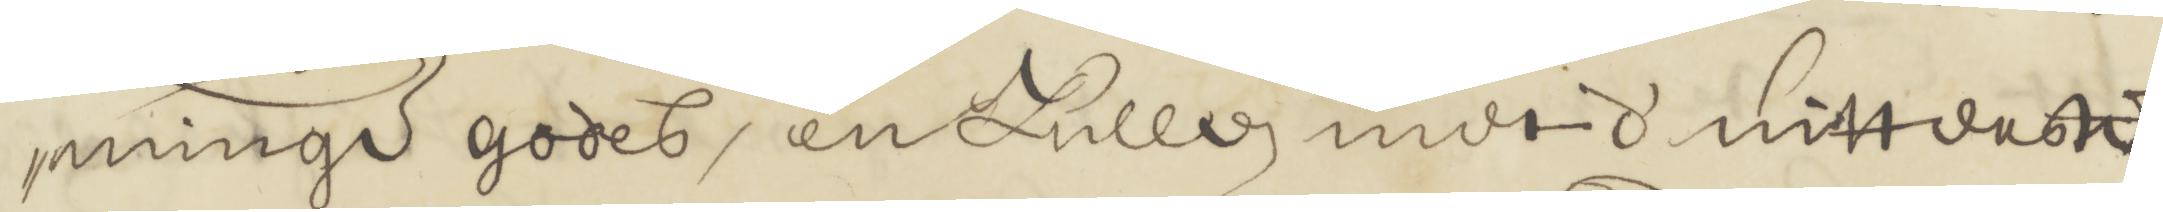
„minge godes, en sullen met d’ uitterste
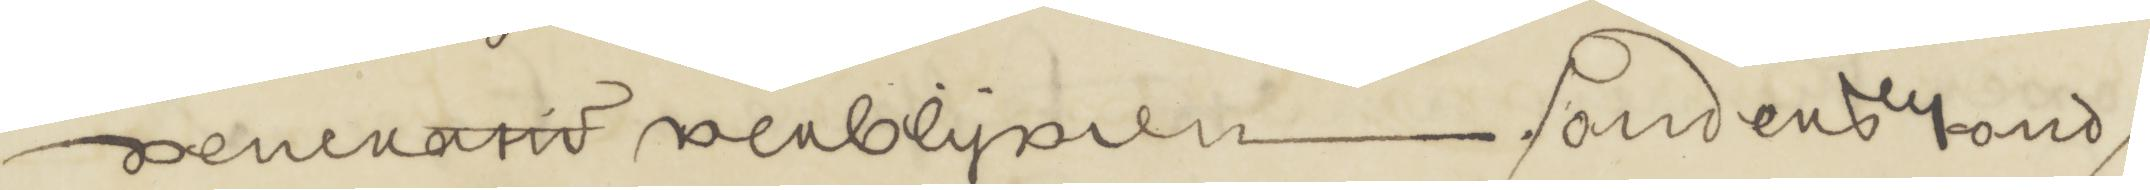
veneratie verblijven. /onderstond/
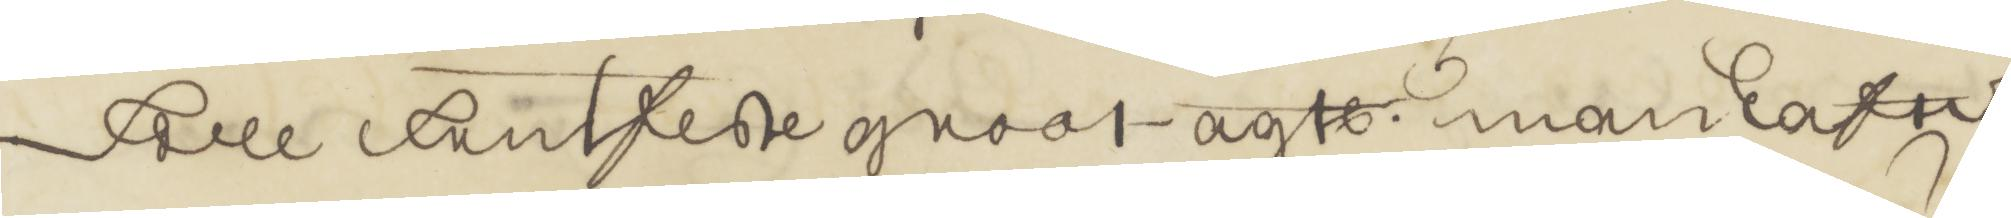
Edele Erntfeste groot agtb: manhafte
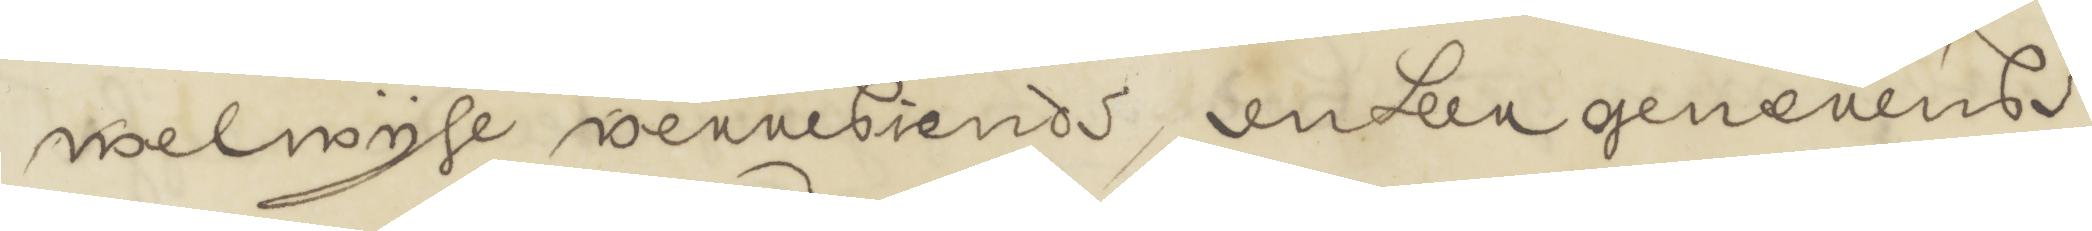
welwijse verresiende, en seer genereuse
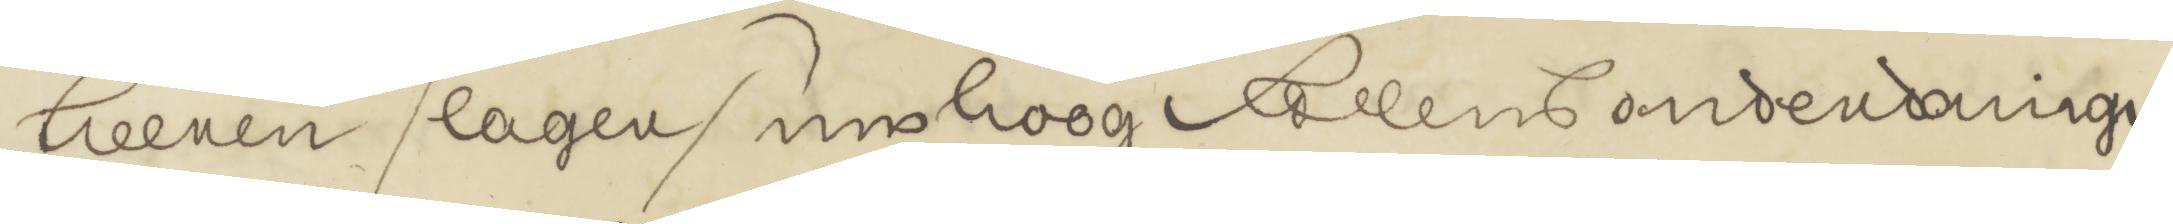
heeren /lager/ uw hoog Edelens onderdanige
